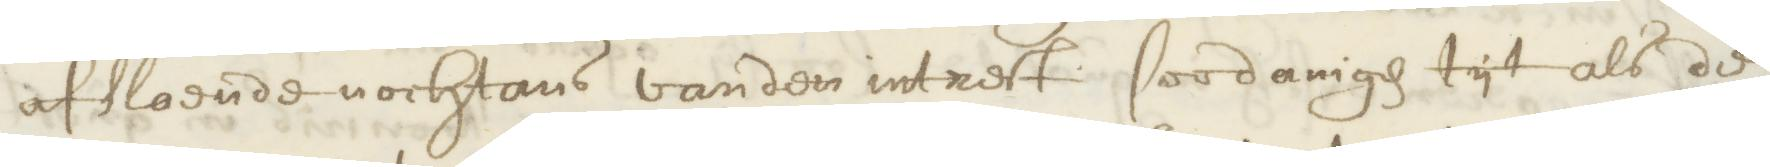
afslaende nochtans van den intrest soodanigen tijt als de
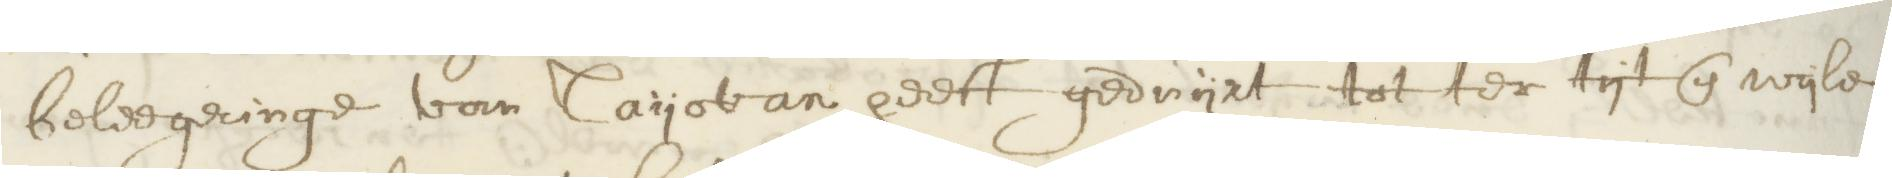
beleegeringe van Taijovan heeft geduijrt tot ter tijt ende wijle
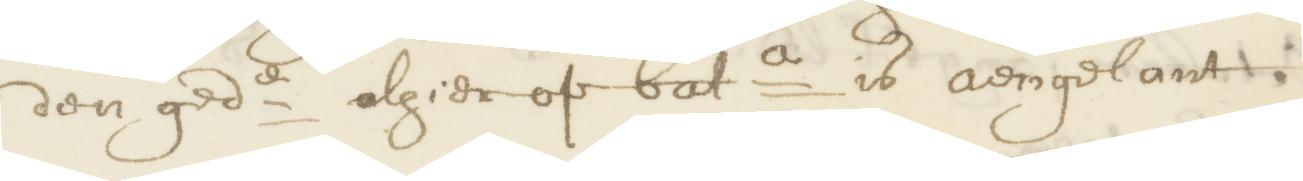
den ged=e alhier op bat=a is aengelant
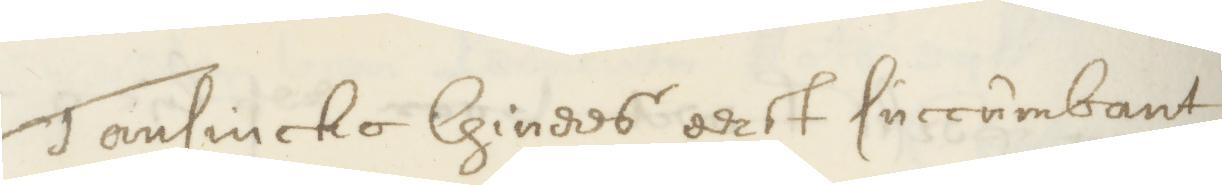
Tansincko Chinees eerst succumbant
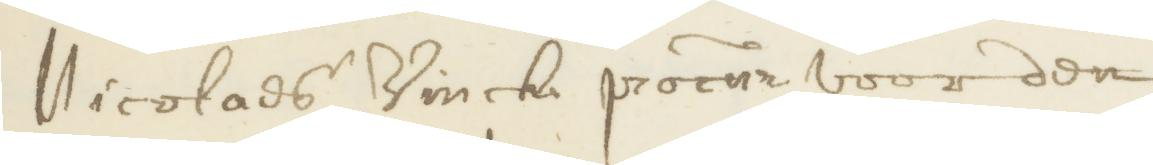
Nicolaes Vinck procur voor den
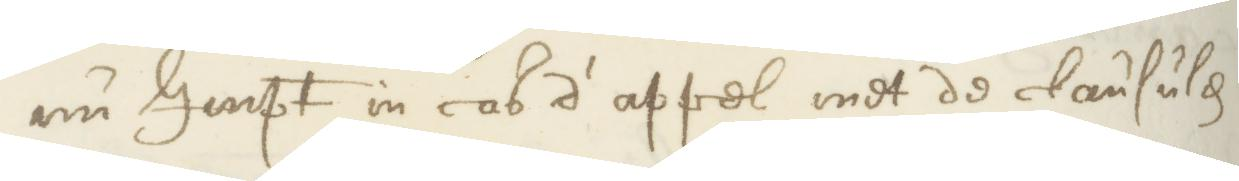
nu Jmpt in cas d’ appel met de clausulen
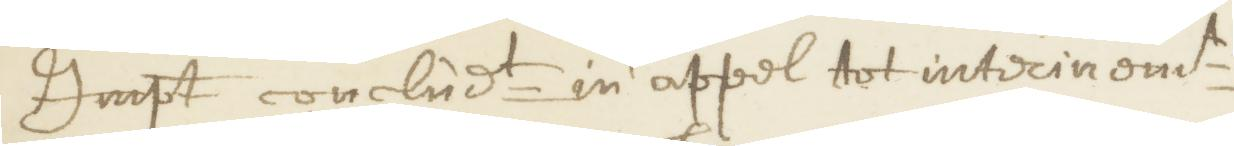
Jmpt conclud=t in appel tot interinem=t
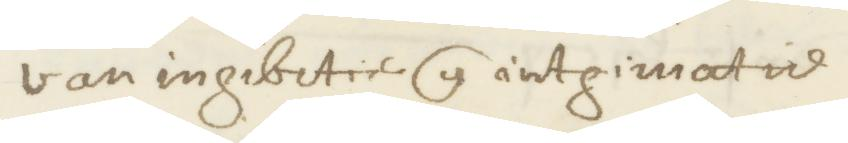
van inhibitie ende inthimatie
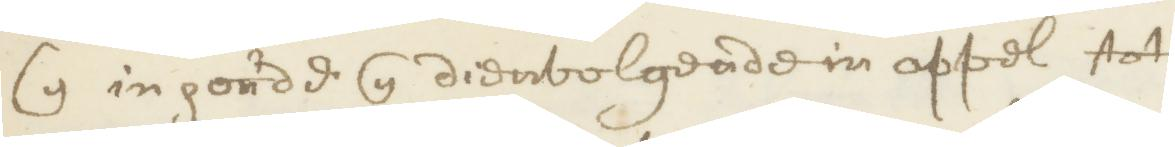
ende in houde ende dienvolgende in appel tot
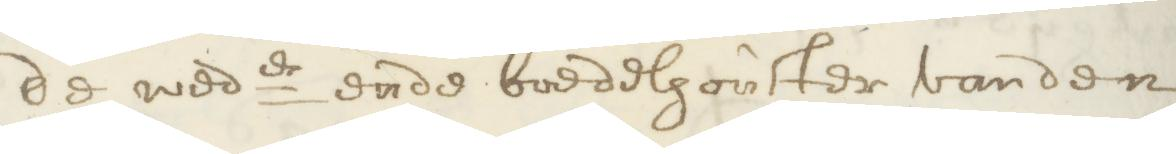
de wed=e ende boedelhouster van den
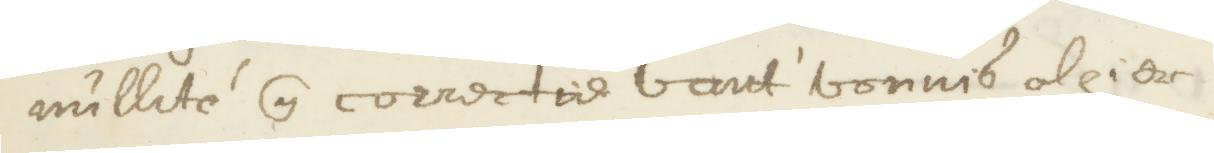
millité ende correctie vant' vonnis alhier
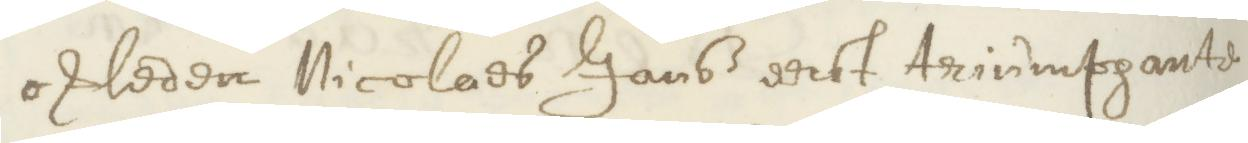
overleden Nicolaes Jansz eerst triumphante
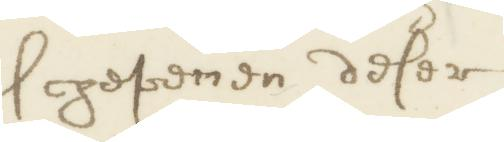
schepenen deser
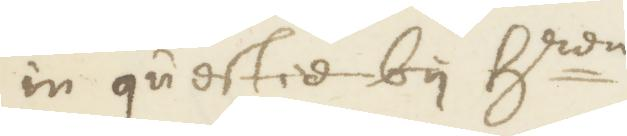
in questie bij H=ren
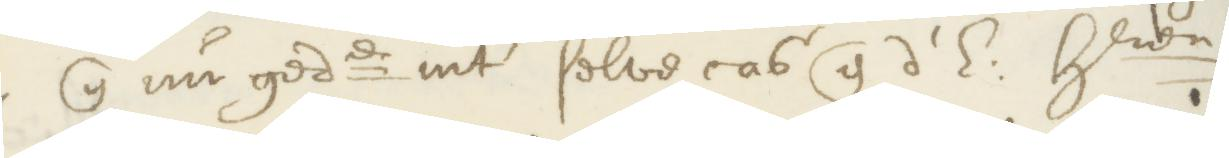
ende nu ged=e int' selve cas ende d’ E: H=ren
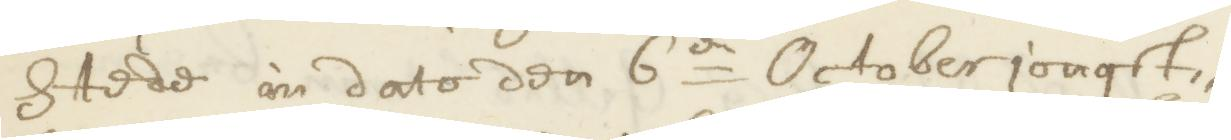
stede in dato den 6=en October jongst„
